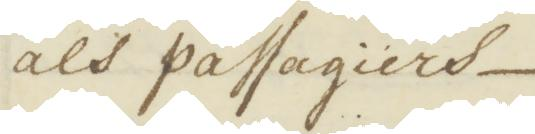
als passagiers —
